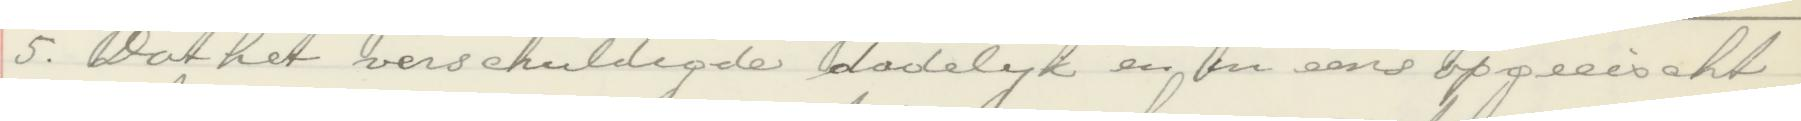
5. Dat het verschuldigde dadelyk en in eens opgeeischt.
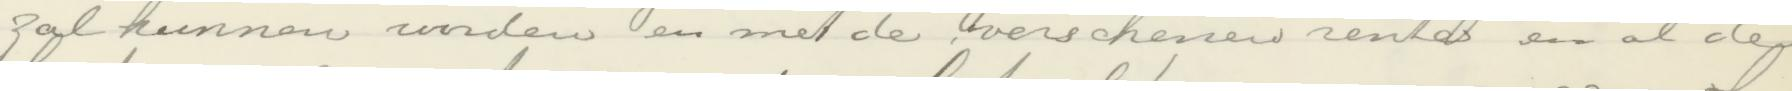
zal kunnen worden en met de verschenen rente en al de
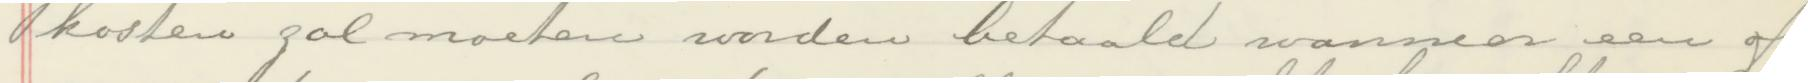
kosten zal moeten worden betaald wanneer een of
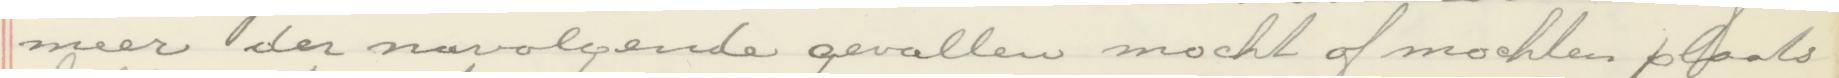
meer der navolgende gevallen mocht of mochten plaats
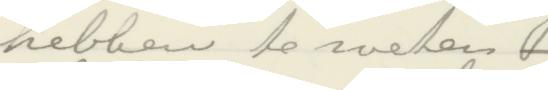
hebben te weten
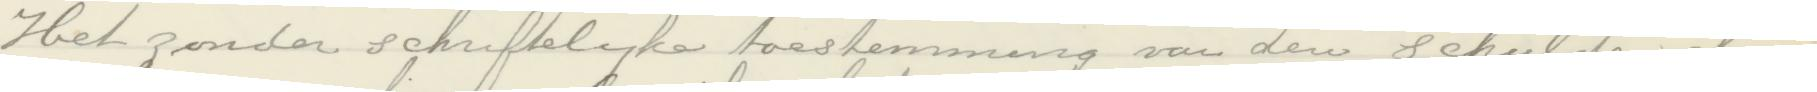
Het zonder schriftelyke toestemming van den schuldeischer
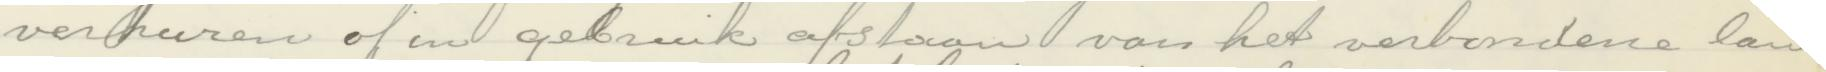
verhuren of in gebruik afstaan van het verbondene lan
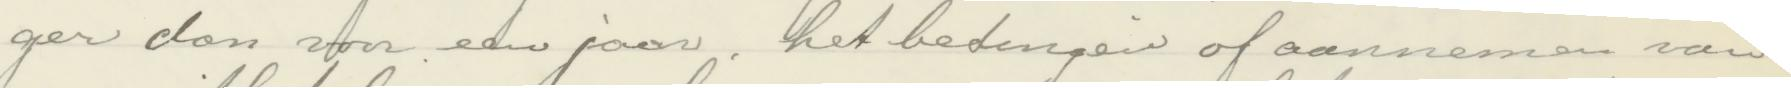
ger dan voor een jaar, het bedingen of aannemen van
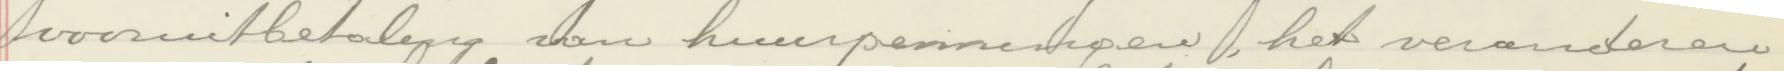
vooruitbetaling van huurpenningen het veranderen
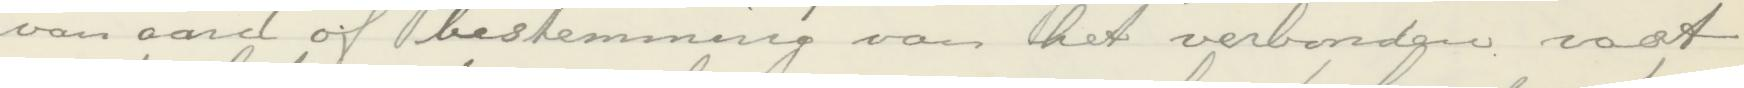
van aard of bestemming van het verbonden, vast
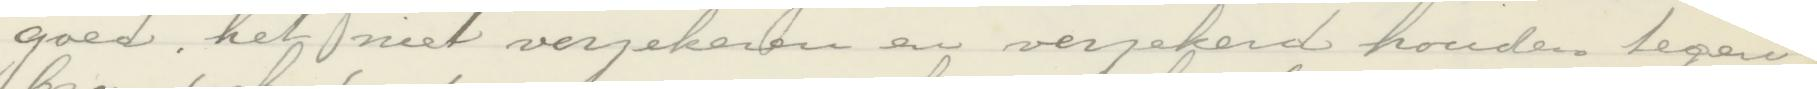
goed, het niet verzekeren en verzekerd houden tegen
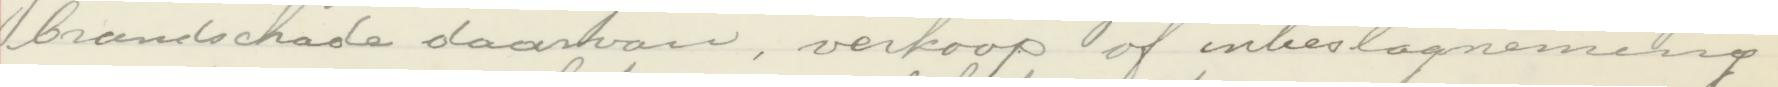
brandschade daarvan, verkoop of inbeslagneming
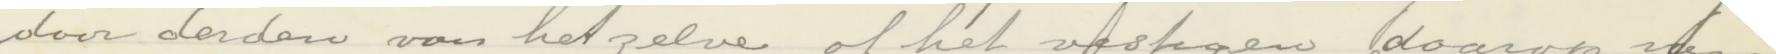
door derden van het zelve of het vestigen daarop van
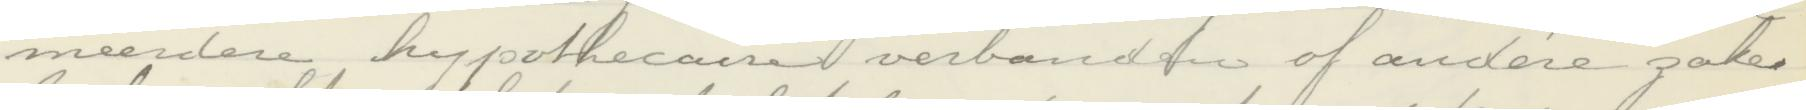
meerdere hypothecaire verbanden of andere zake
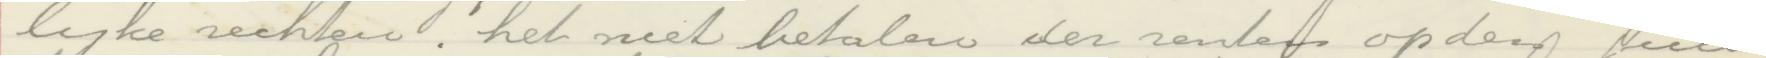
lyke rechten, het niet betalen der renten op den juis
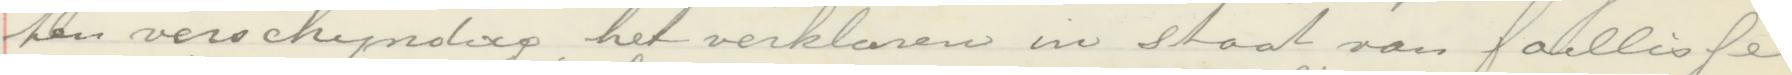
ten verschyndag het verklaren in staat van faillisse
